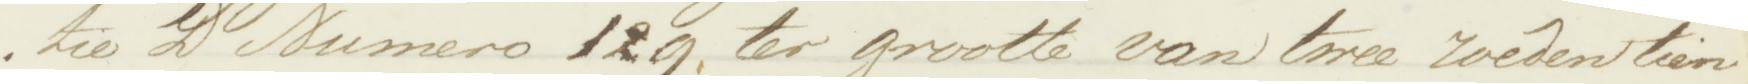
„tie D Numero 129, ter grootte van twee roeden tien
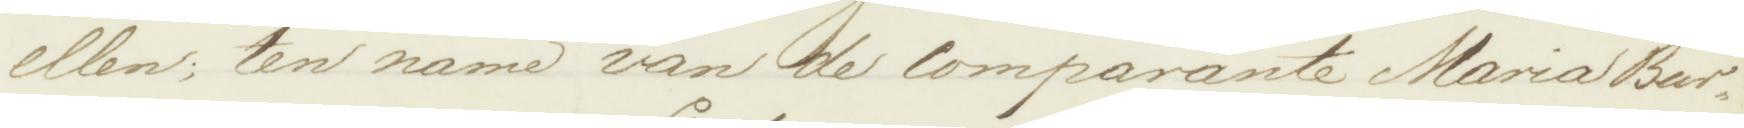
ellen; ten name van de Comparante Maria Bur„
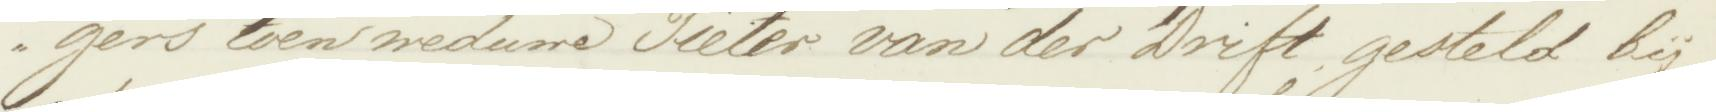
„gers toen weduwe Pieter van der Drift, gesteld bij
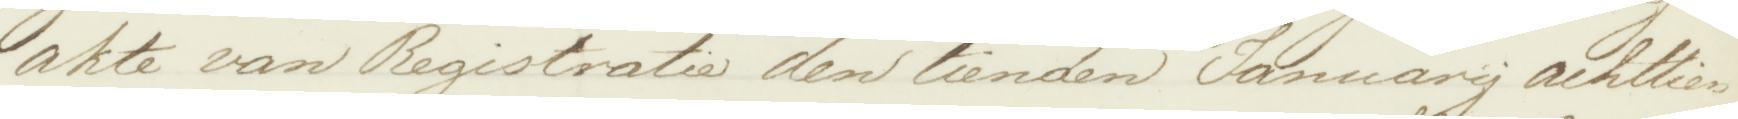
akte van Registratie den tienden Januarij achttien
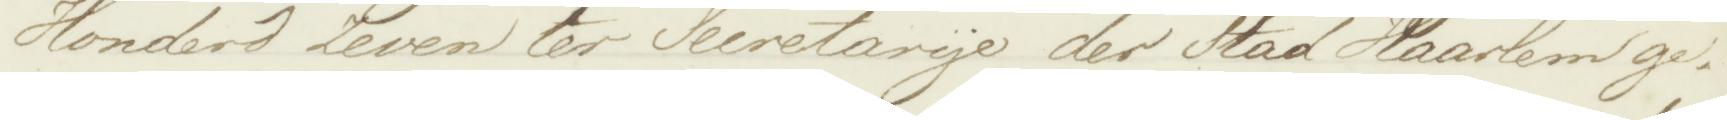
Honderd Zeven ter Secretarije der stad Haarlem ge„
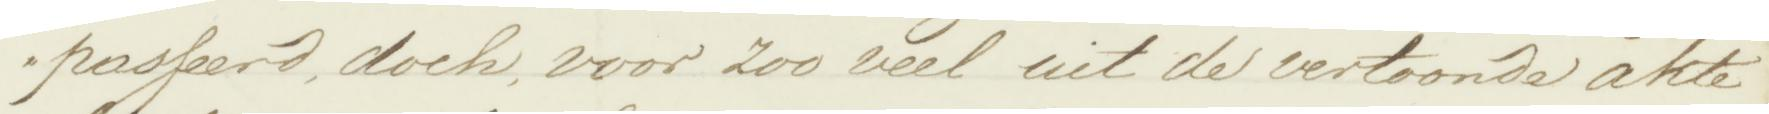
„passeerd, doch, voor zoo veel uit de vertoonde akte
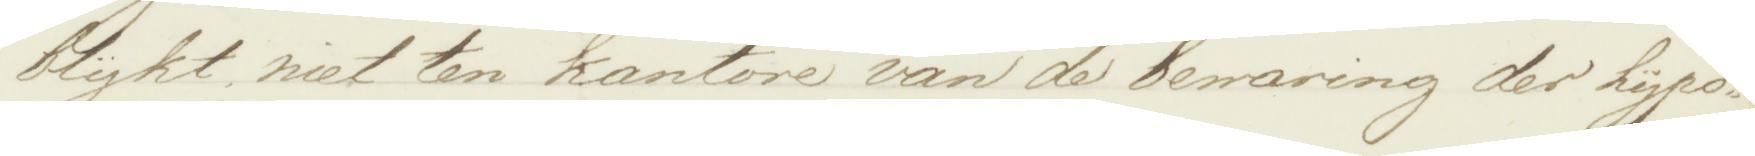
blijkt, niet ten kantore van de bewaring der hijpo„
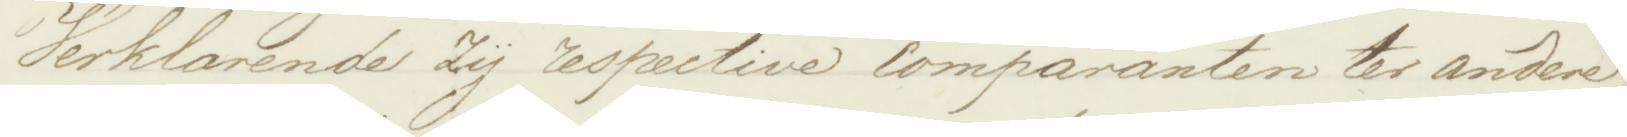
Verklarende zij respective comparanten ter andere
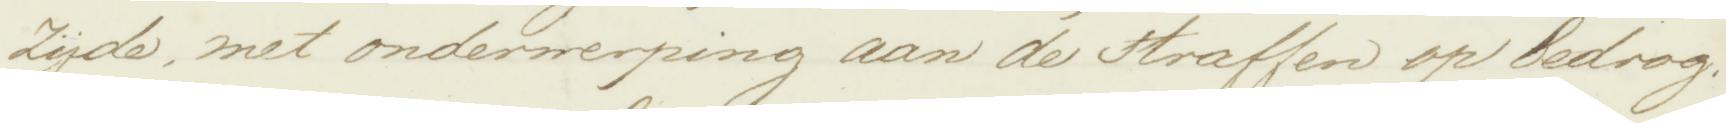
zijde, met onderwerping aan de straffen op bedrog,
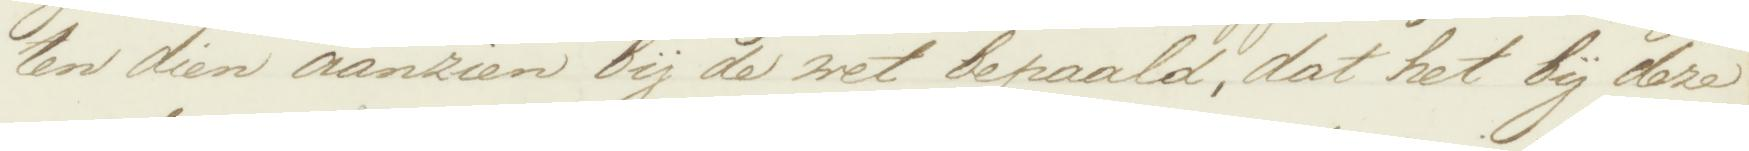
ten dien aanzien bij de wet bepaald, dat het bij deze
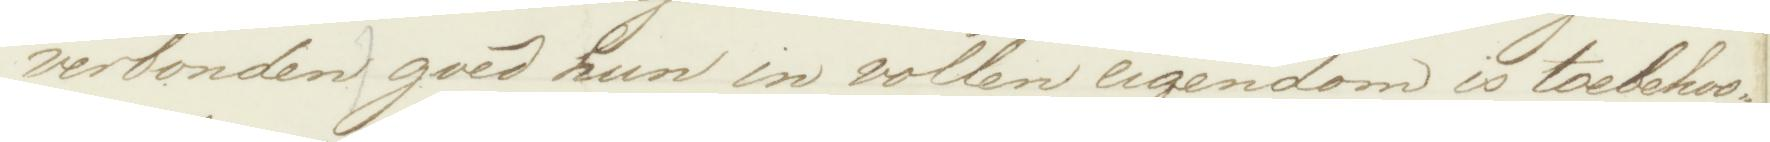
verbonden goed hun in vollen eigendom is toebehoo„
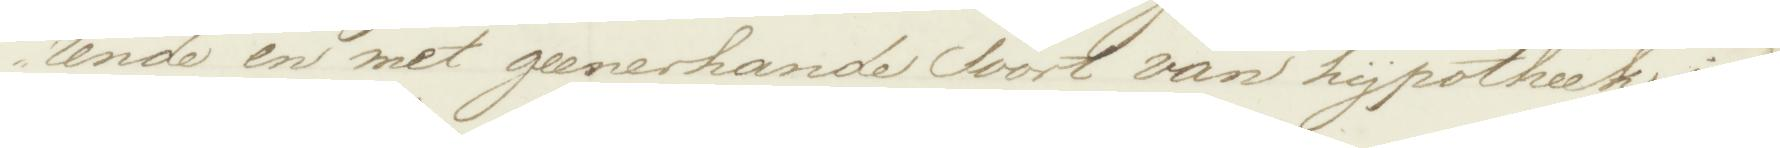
„rende en met geenerhande soort van hijpotheek is
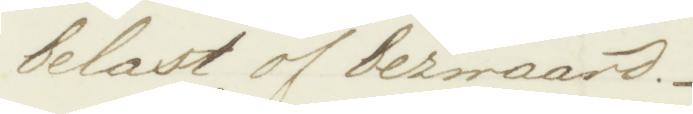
belast of bezwaard.
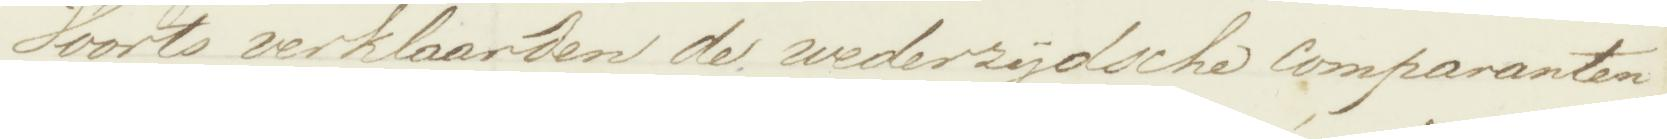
Voorts verklaarden de wederzijdsche comparanten
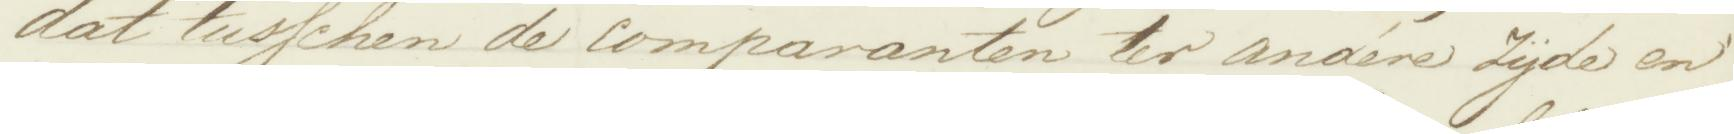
dat tusschen de comparanten ter andere zijde en
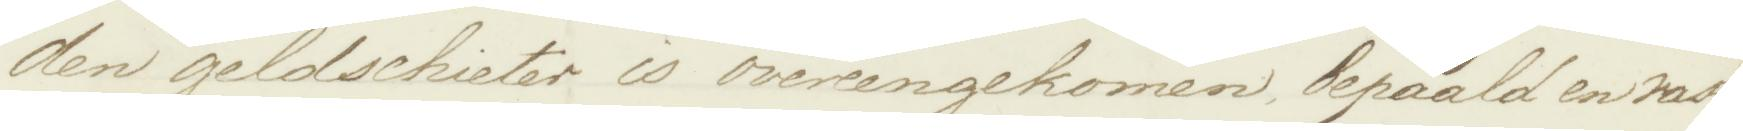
den geldschieter is overeengekomen, bepaald en vast
